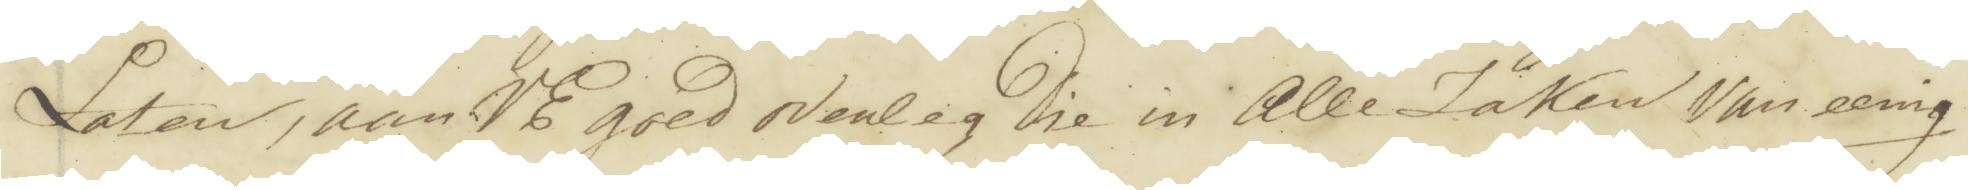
Laten, aan VE goed overleg die in alle zaken van eenig
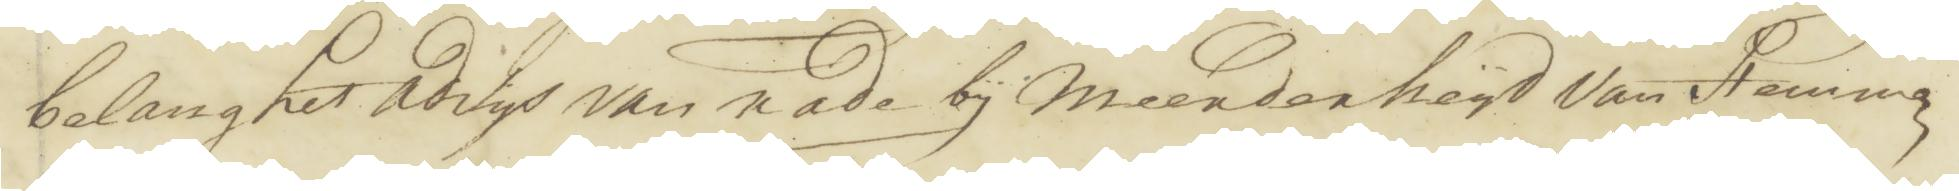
belang het advijs van rade bij meerderheijd van stemmen
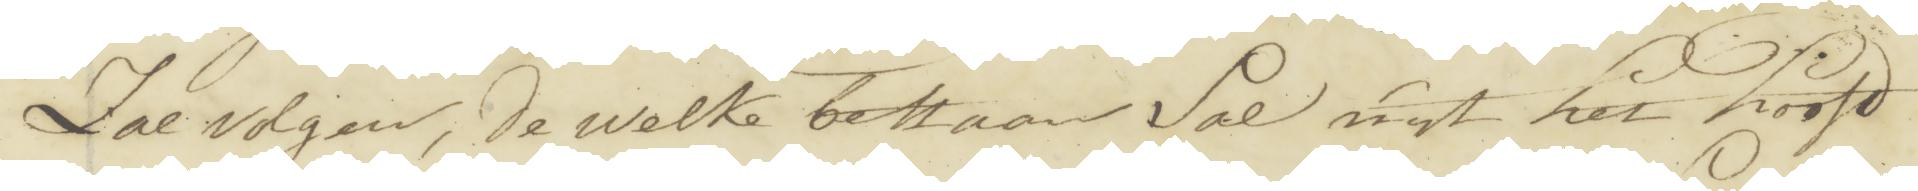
zal volgen, de welke bestaan sal uyt het hoofd
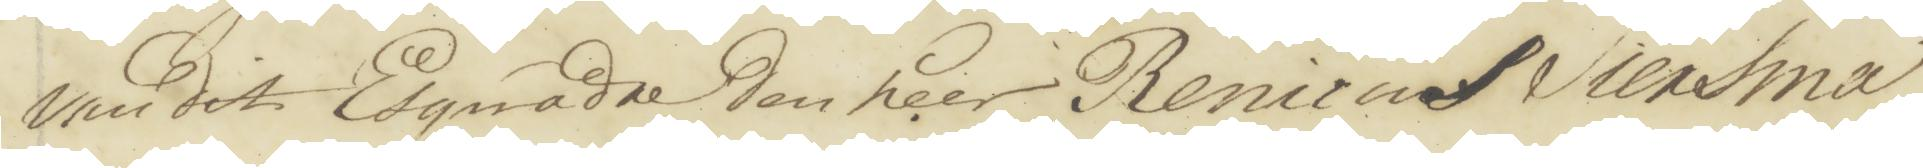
van dit Esquadre den heer Renicus Siersma
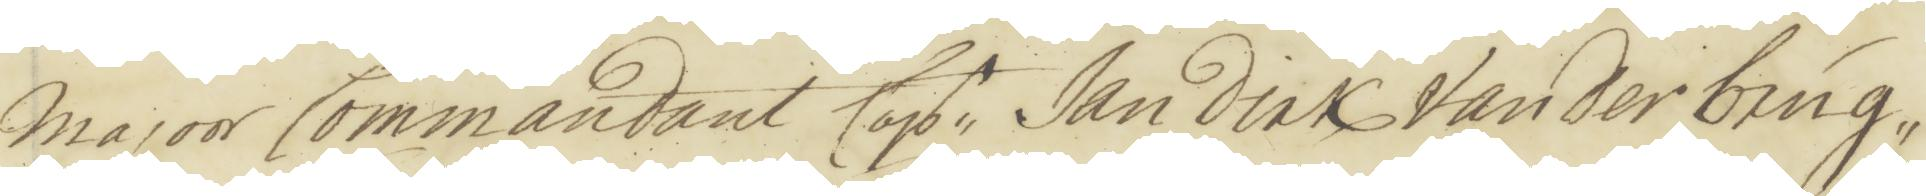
majoor Commandant Cap„t Jan dirk van der brug„
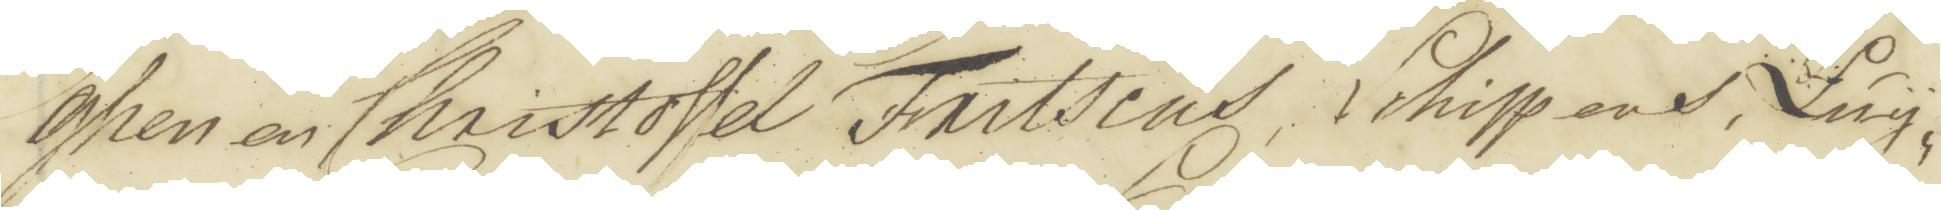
ghen en Christoffel Fritscus, schippers, Luij„
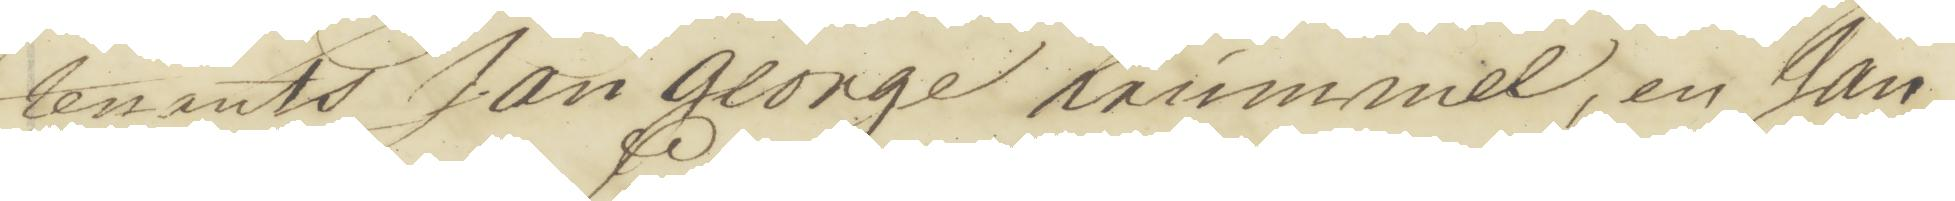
tenants Jan george krummel, en Jan
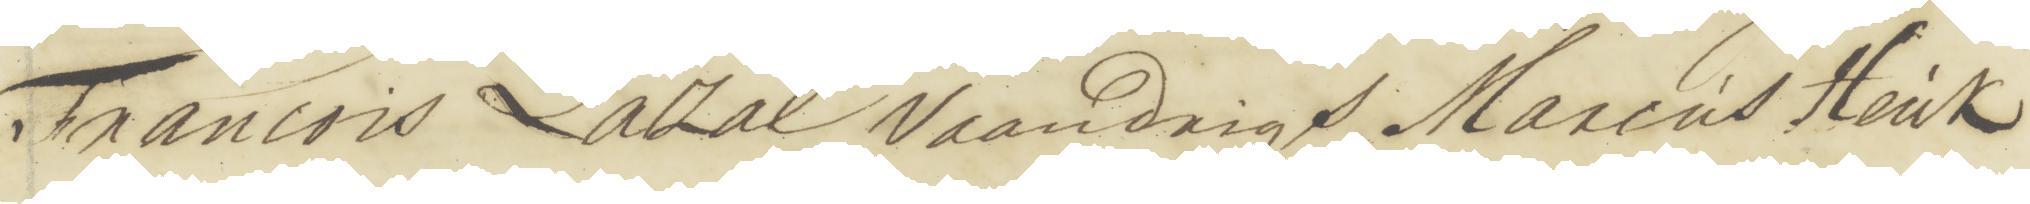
Francois Lazal vaandrigs, Marcus Heuk
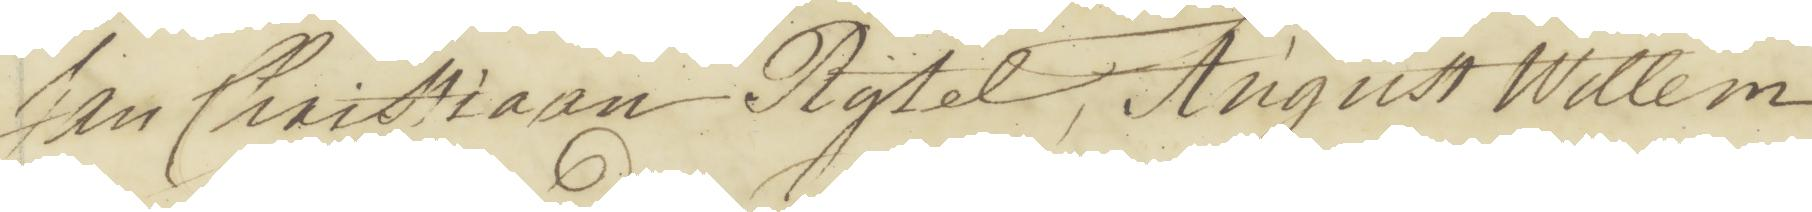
Jan Christiaan Rytel, August Willem
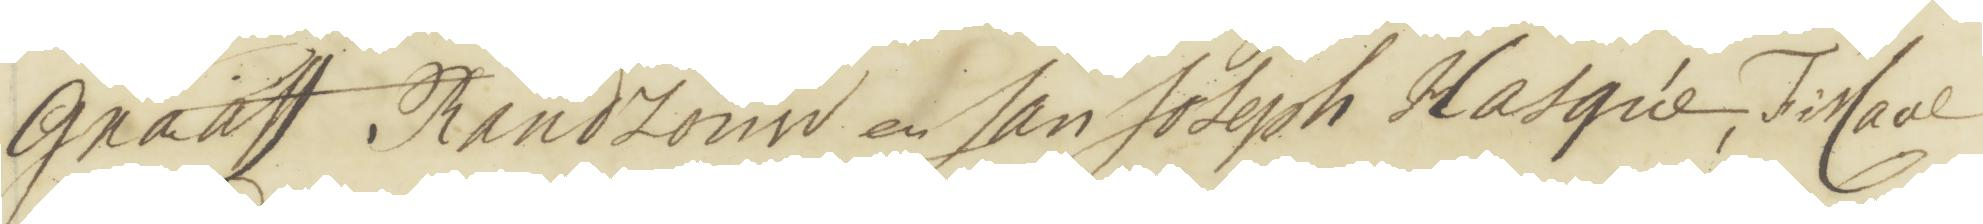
graaf Randzouw en Jan Joseph Hasque, Fiscave
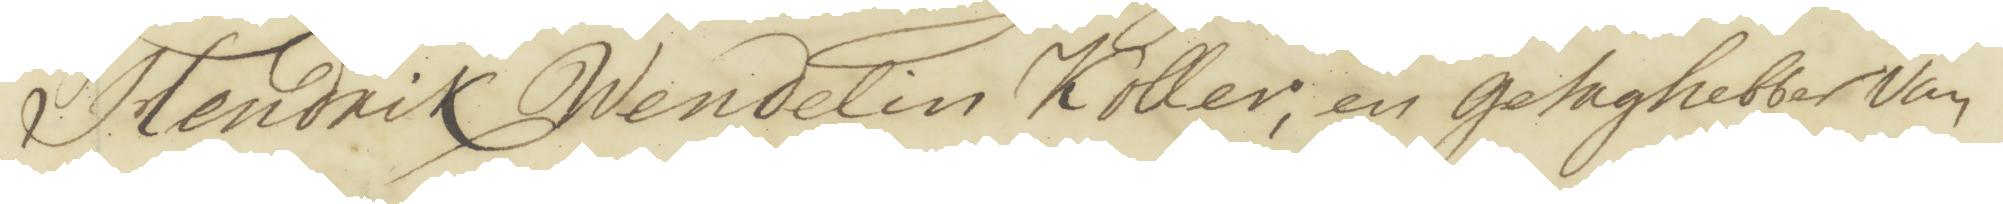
Hendrik Wendelin Koller, en gesaghebber van
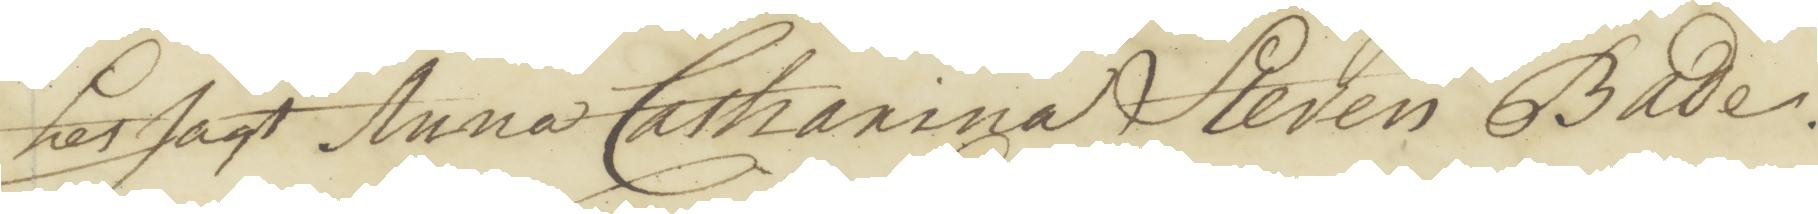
het Jagt Anna Catharina Steven Bade.
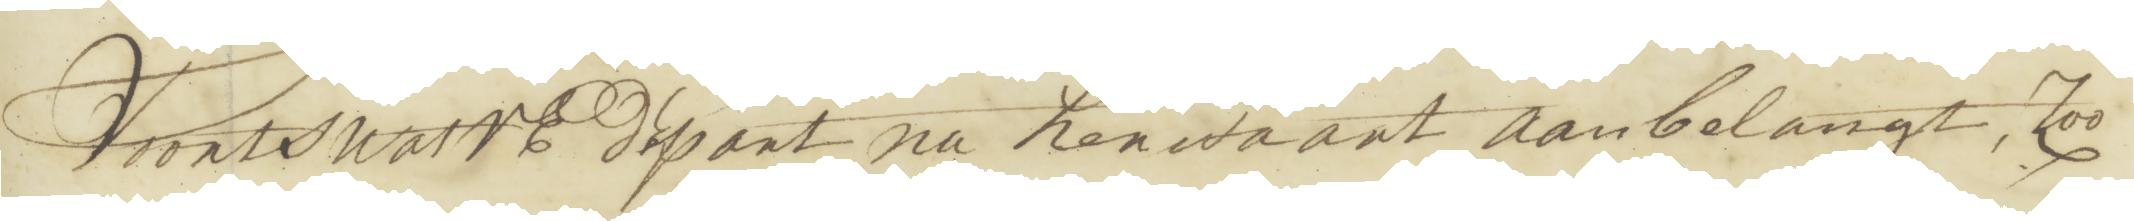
Voorts wat VE depart na herwaart aan belangt, zoo
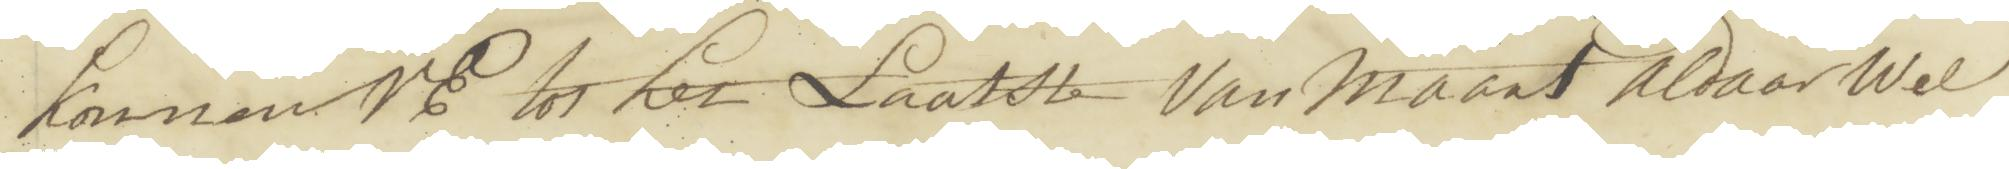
konnen VE tot het Laatste van maart aldaar wel
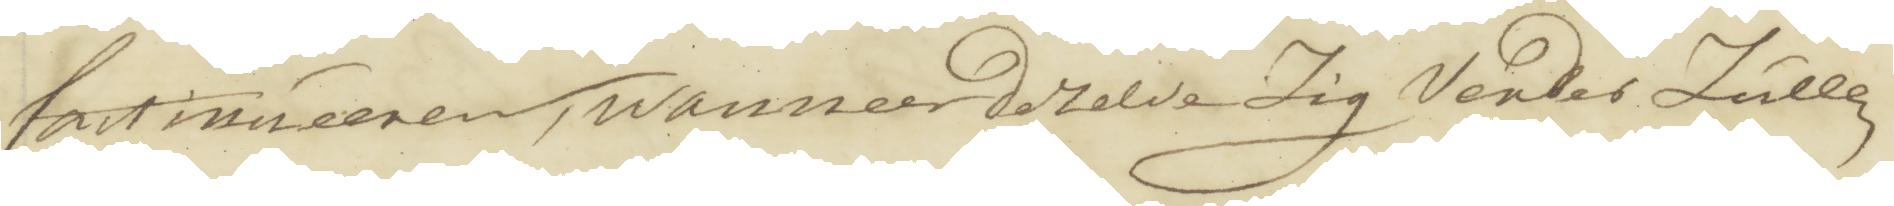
Continueeren, wanneer dezelve zig verder zullen
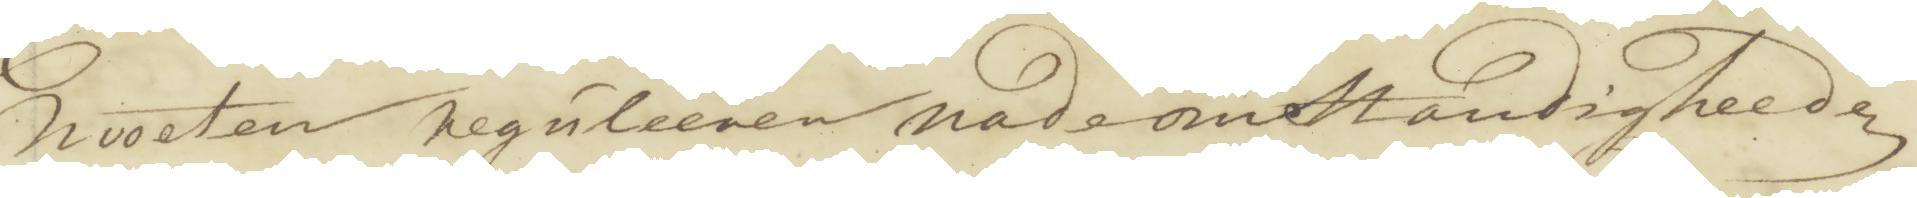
moeten reguleeren na de omstandigheeden
